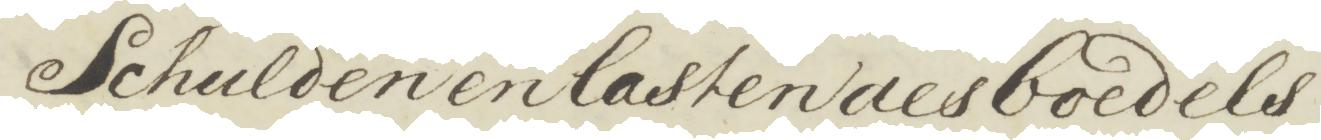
Schulden en lasten des boedels
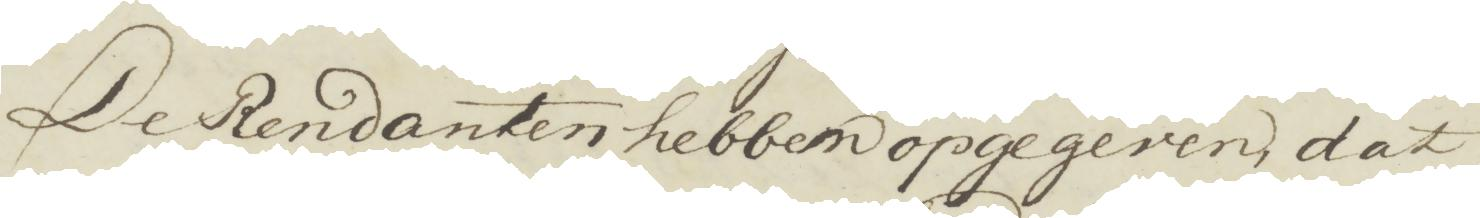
De Rendanten hebben opgegeven, dat
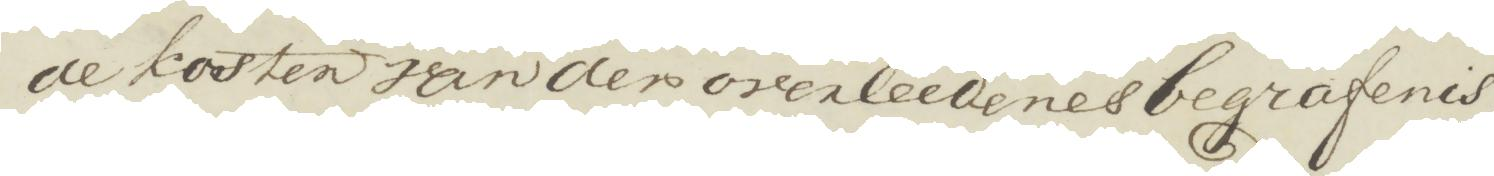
de kosten van der overleedenes begrafenis
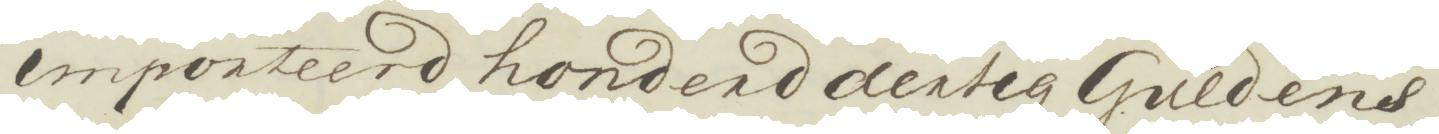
importeerd honderd dertig Guldens
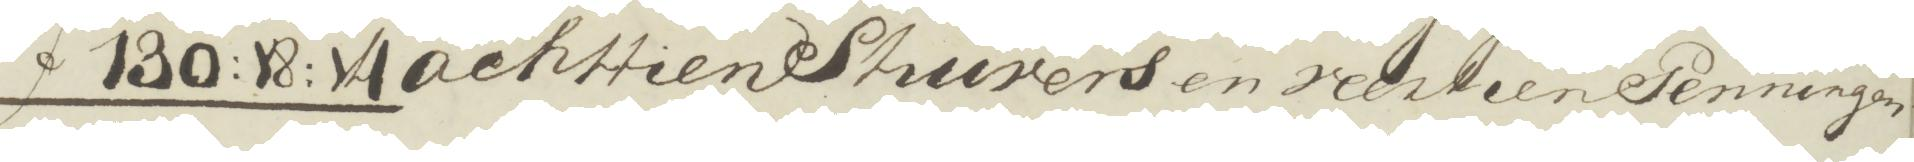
ƒ 130:18:14 achttien Stuivers en veertien Penningen
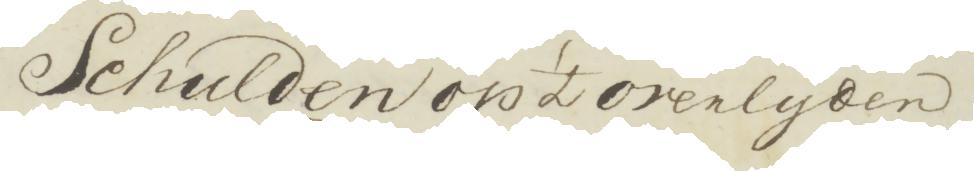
Schulden op 't overlyden
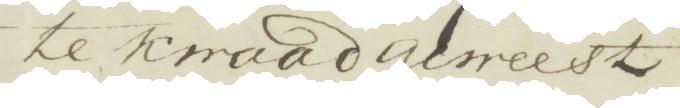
te kwaad geweest
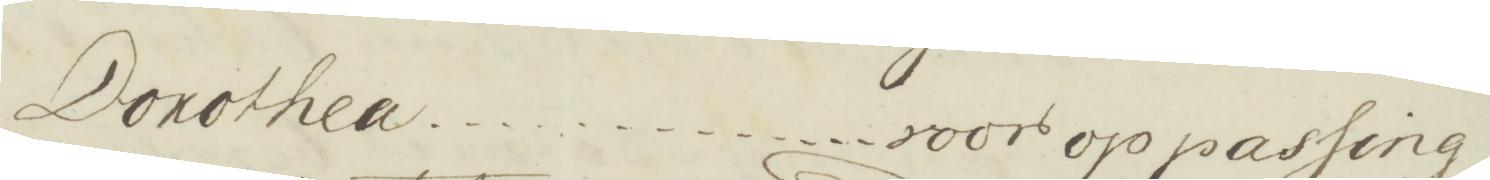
Dorothea . . . . . . . . . . . . . voor op passing
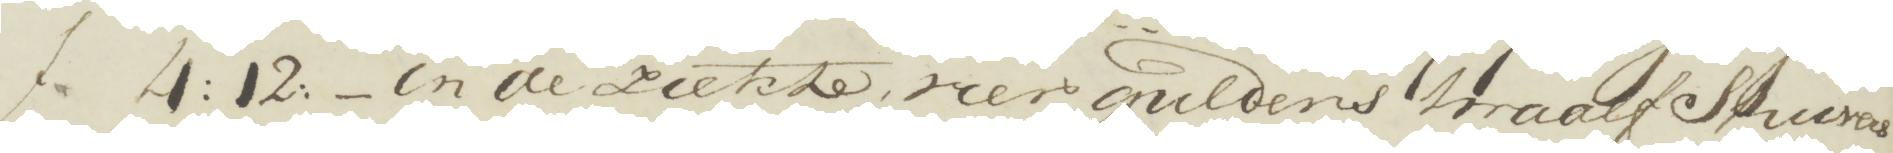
ƒ 4: 12: – in de zichte, vier gudens twaalf Stuivers
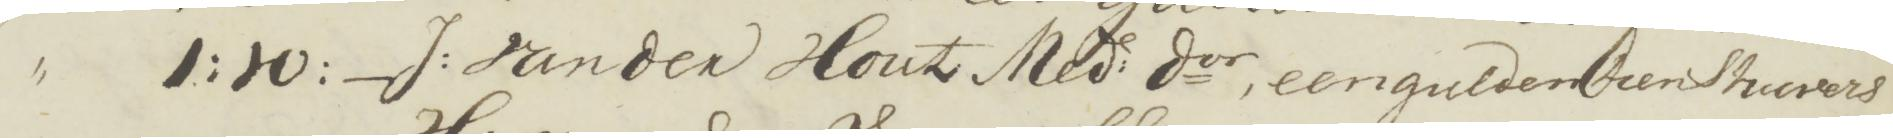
„ 1: 10:– J: van der Hout Med:e d=or, een gulden tien stuivers
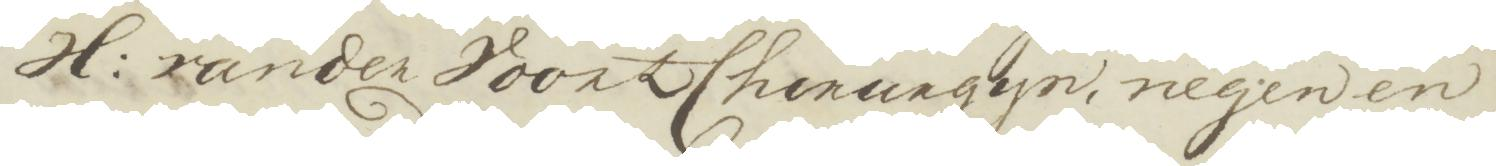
H: vander Voort Chirurgyn, negen en
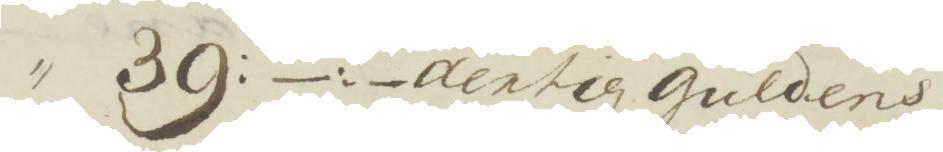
„ 39: — : – dertig guldens
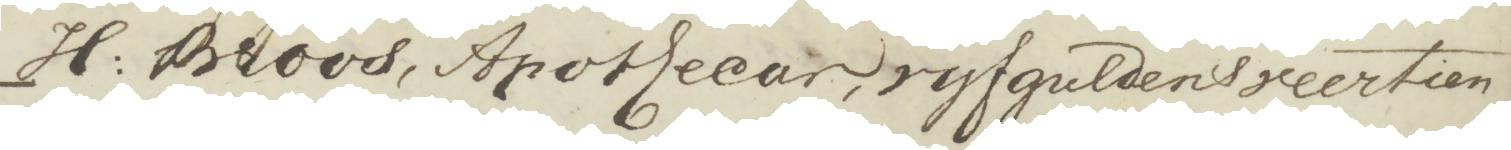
H: Broos, Apothecar, vyf guldens veertien
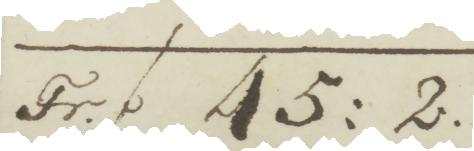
Fr. ƒ 45: 2.
